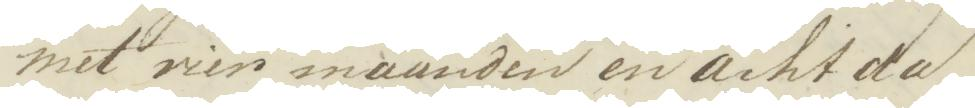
met vier maanden en acht da
